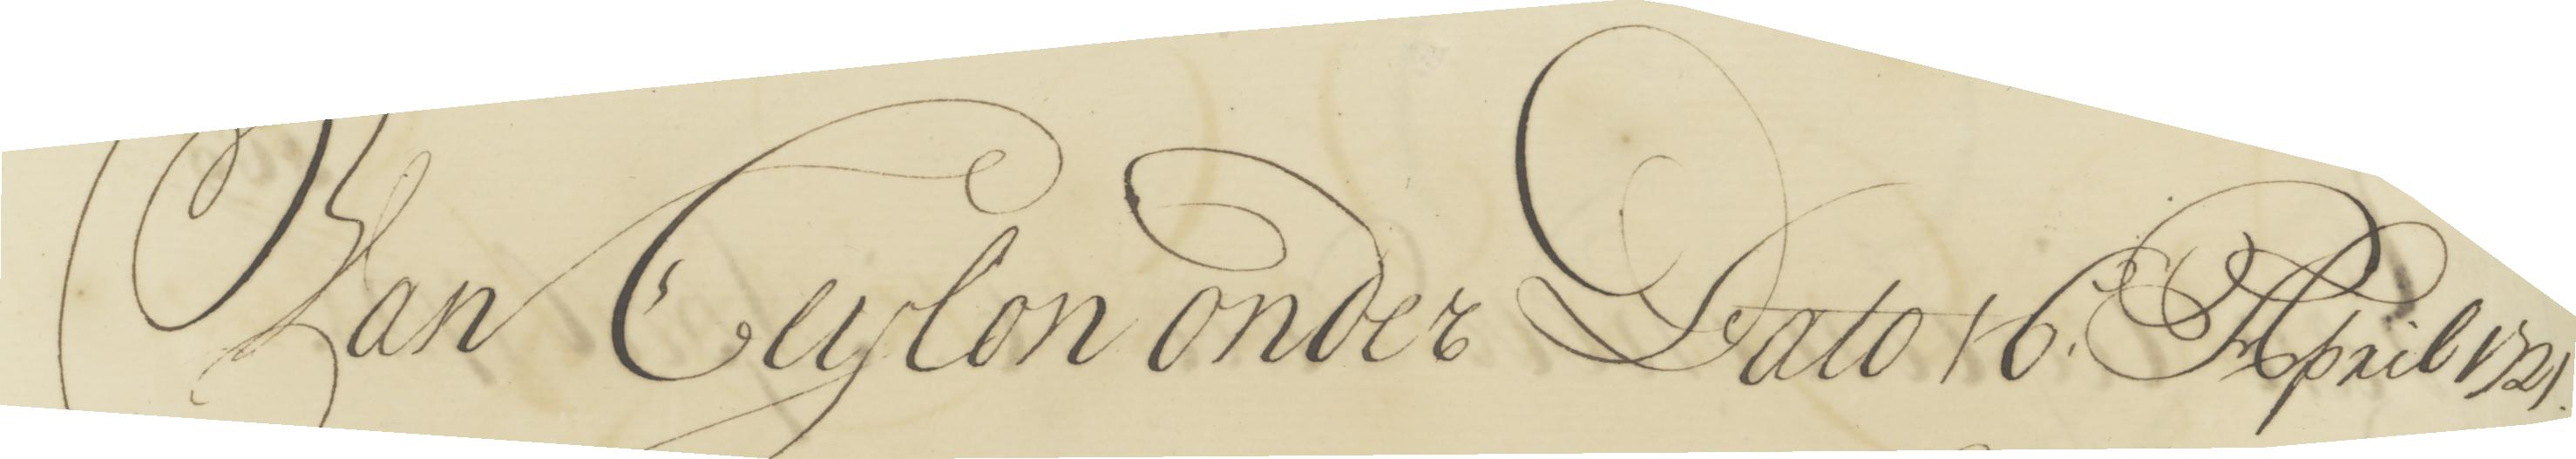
Van Ceylon onder Dato 16' April 1721.
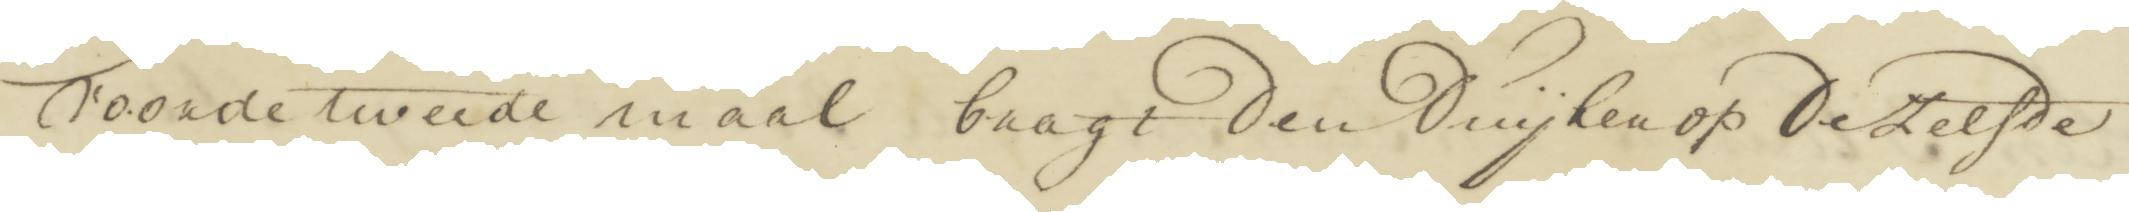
voorde tweede maal bragt den duijker op dezelfde
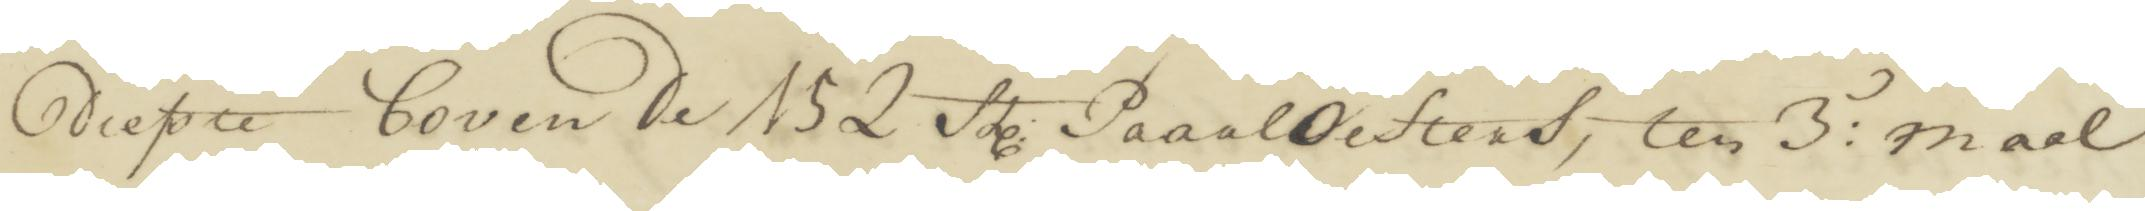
diepte boven de 152 stx: Paarloesters, ten 3:' maal
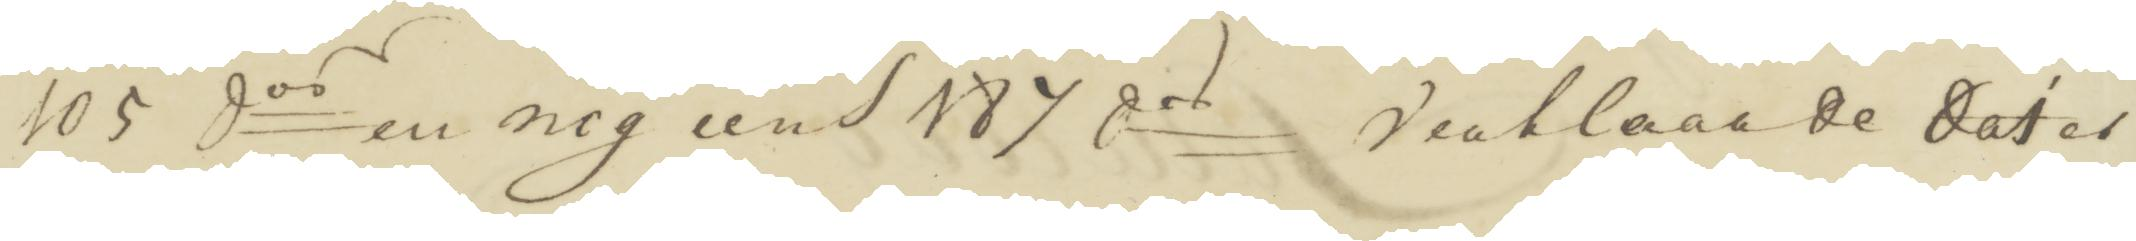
105 d=os en nog eens 187 d=os verklaarde dat 'er
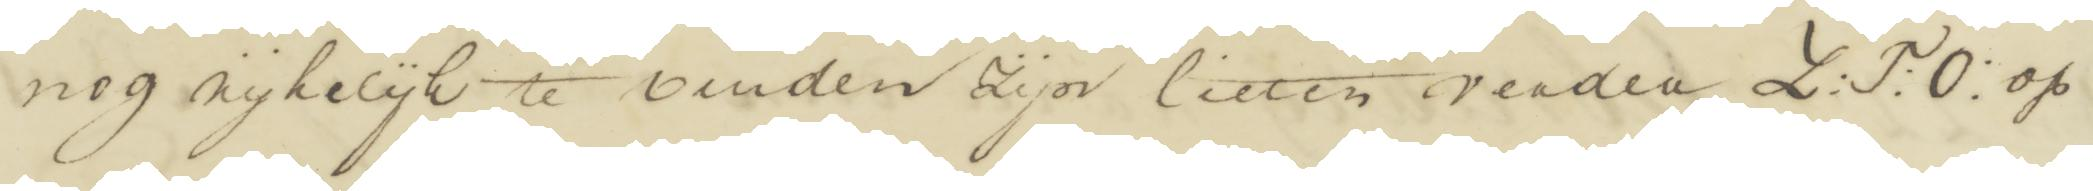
nog rijkelijk te vinden zijn lieten verder Z: T: O: op
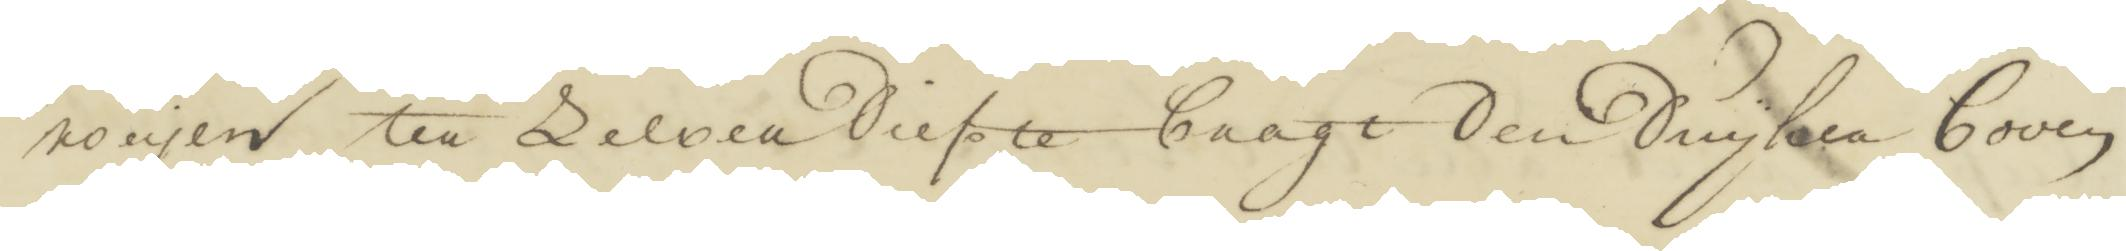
roeijen ter zelver diepte bragt den duijker boven
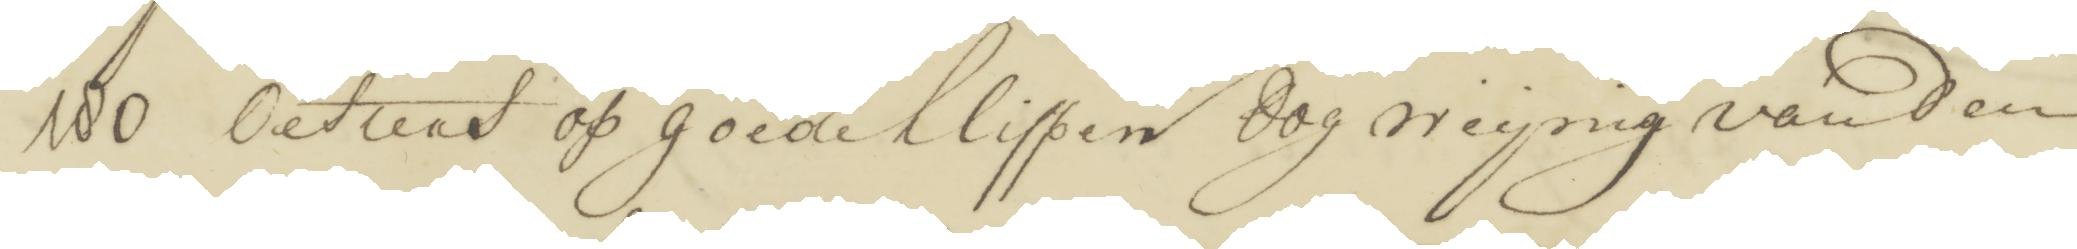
180 Oesters op goede klippen dog weijnig van den
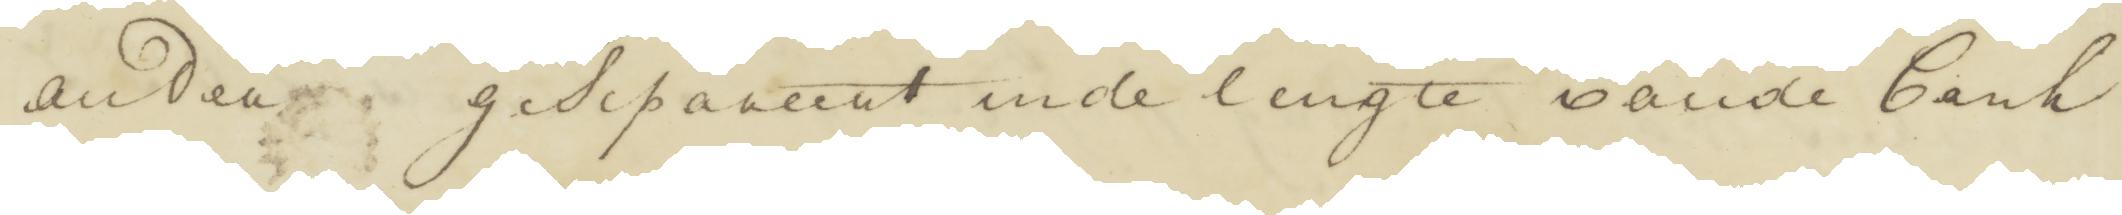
ander gesepareert in de lengte vande bank
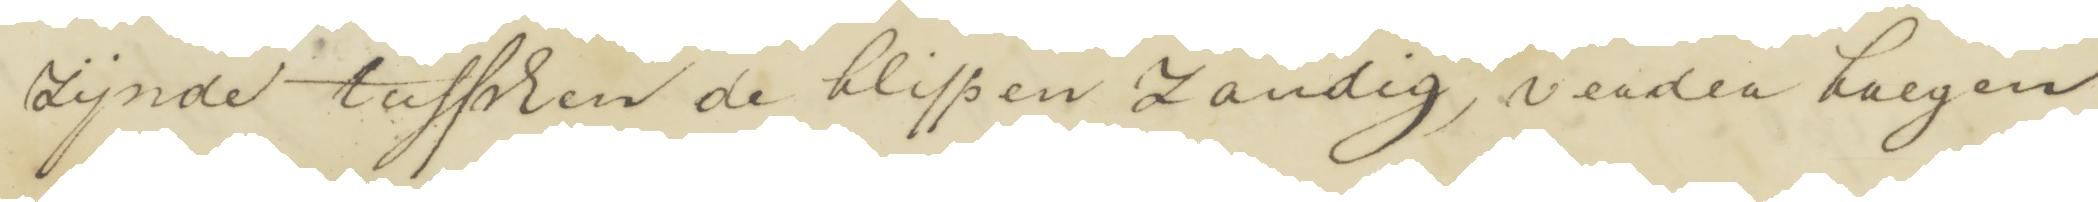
zijnde tusschen de klippen zandig, verder kregen
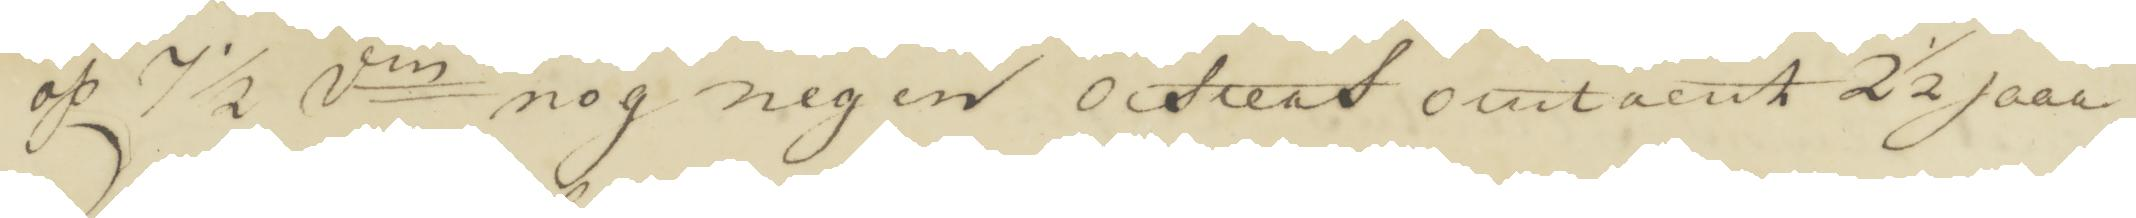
op 7½ V=m nog negen oisters omtrent 2½ jaar
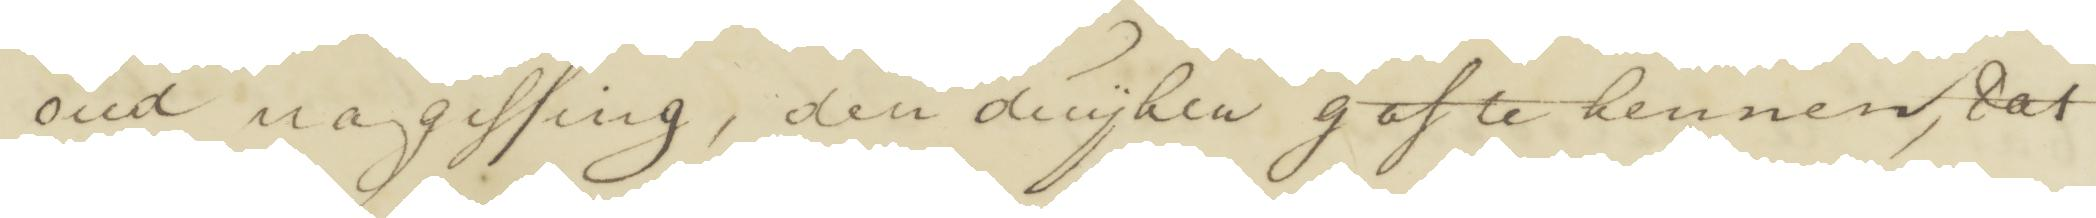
oud na gissing, den duijker gaf te kennen, dat
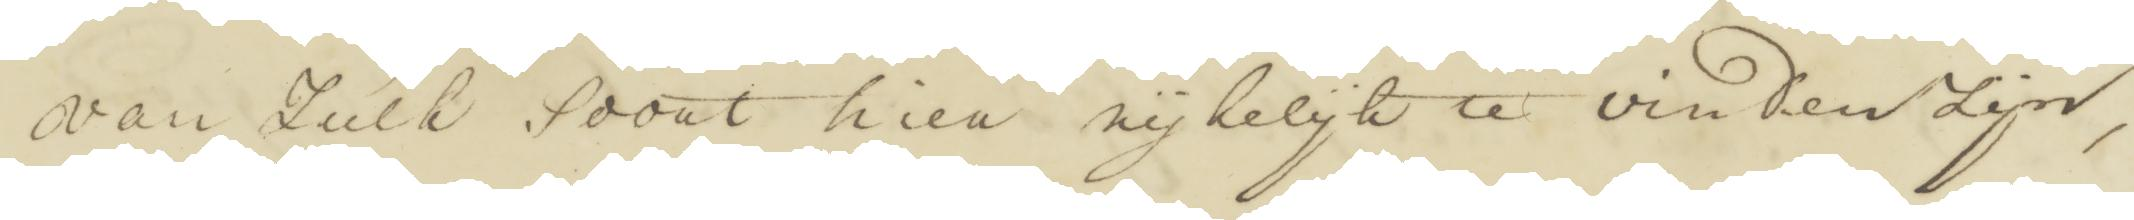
van zulk soort hier rijkelijk te vinden zijn,
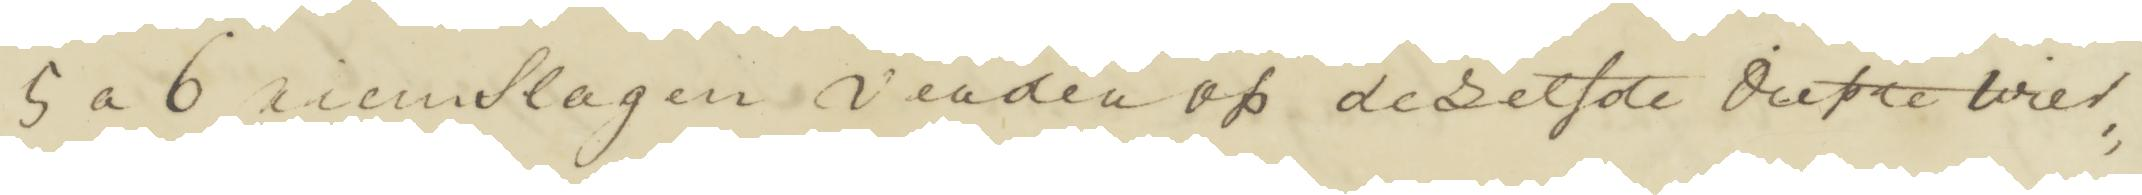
5 a 6 riemslagen verder op dezelfse diepte wier„
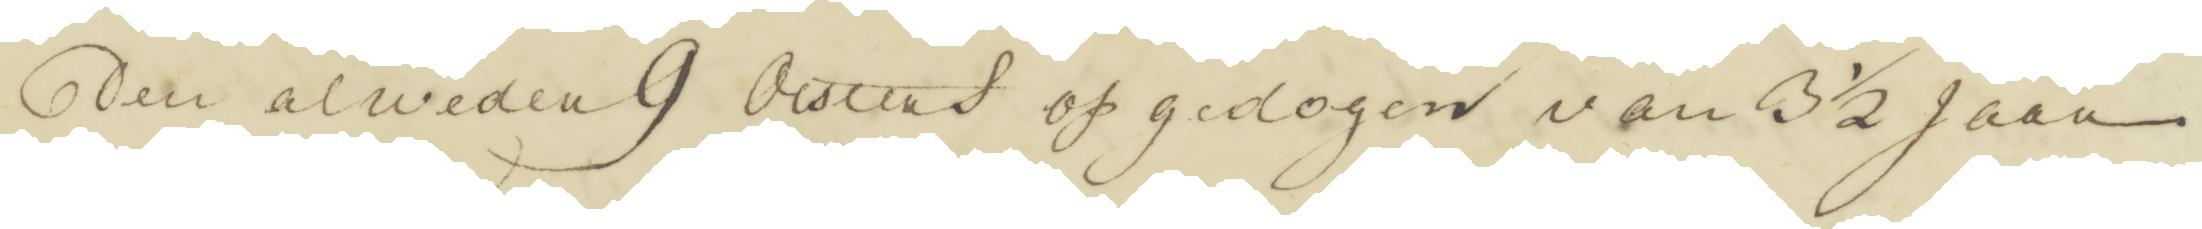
den alweder 9 Oesters op gedogen van 3½ Jaar
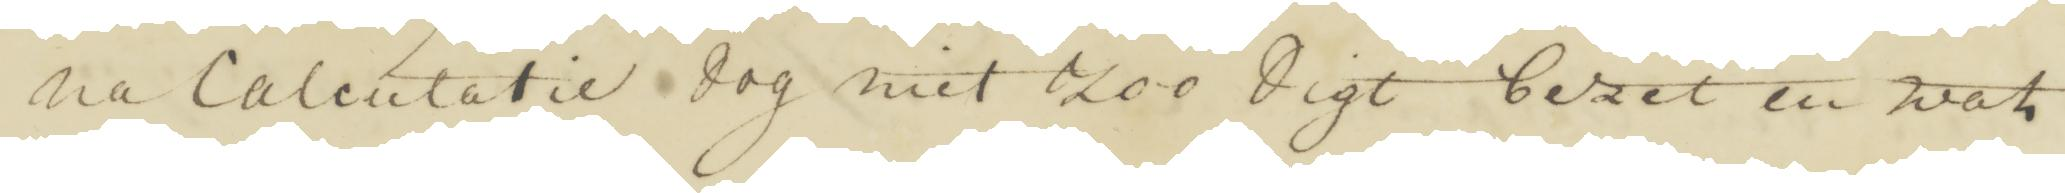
na Calculatie dog niet zoo digt bezet en wat
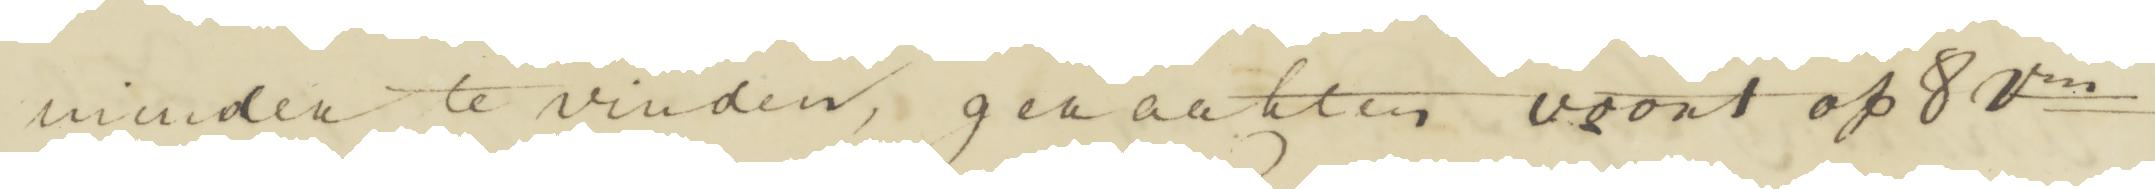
minder te vinden, geraakten voort op 8 V=m
